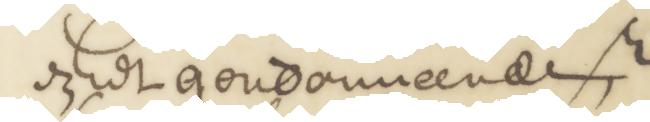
en het g'ordonneerde
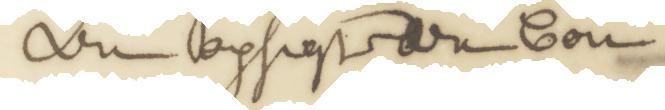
ten opsigt der bou
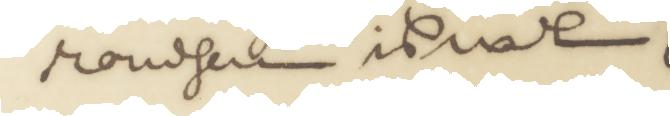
ronesen is wel
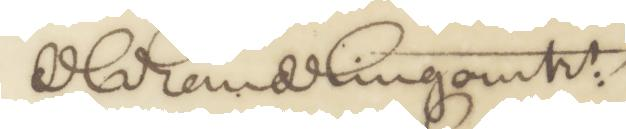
UEHren deling omtr:t
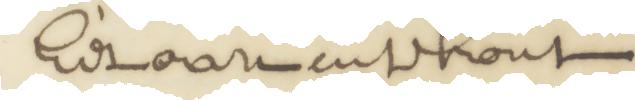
het over en te kort
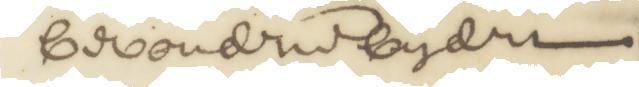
bevondene bij den
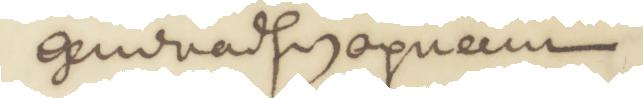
generaelen opneem
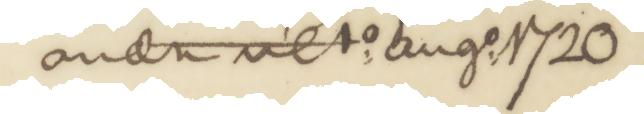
onder ult„o aug„o 1720
